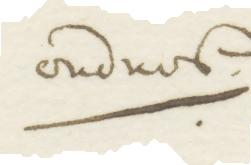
ordres
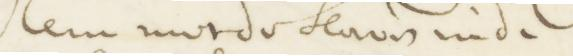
jtem met de staven in de
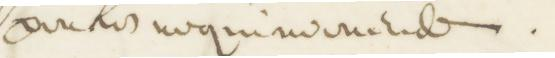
perken requireerende.
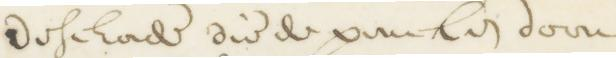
de schade die de percken door
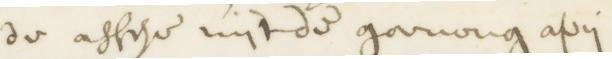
de assche uijt de goerong apij
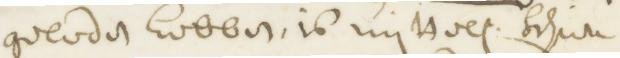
geleden hebben, is uijtterlijk schier
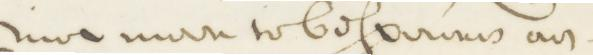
niet meer te bespeuren aen
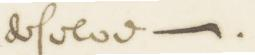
deselve—.
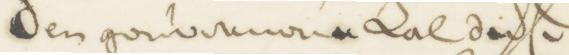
den gouverneur zal diverse
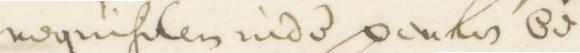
requisiten inde perken be
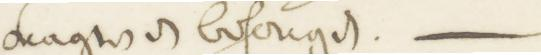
tragten en besorgen. —
